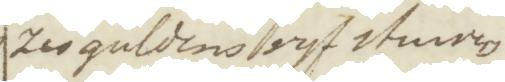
zes guldens vyf stuivers
